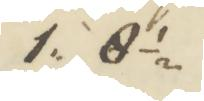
1„ 8½
